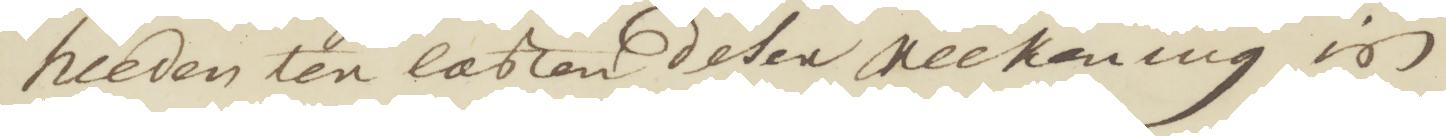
heeden ter lasten deser reekening is
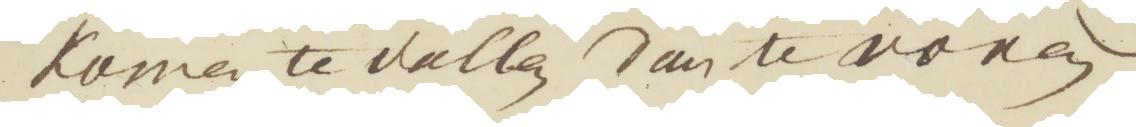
komen te vallen van te voren
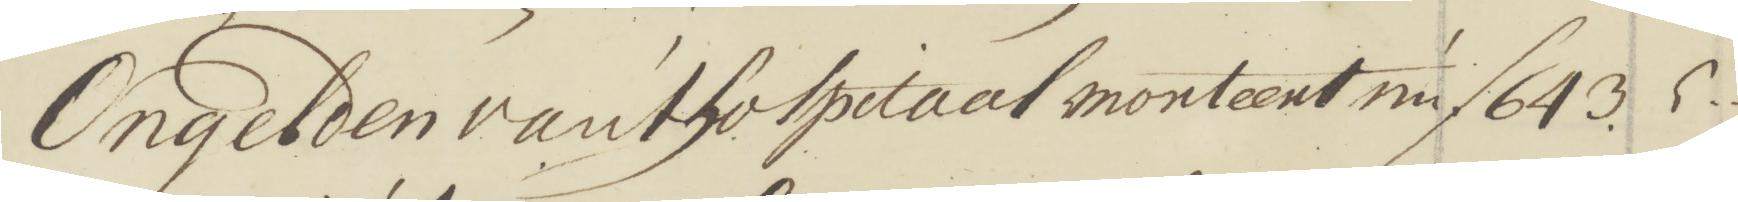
Ongelden van't hospitaal monteert nu ƒ643. 5.
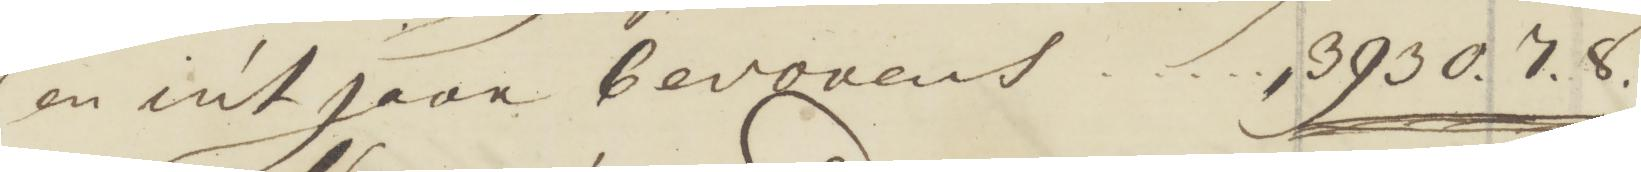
en in't jaar bevorens . . . . . „3930. 7. 8
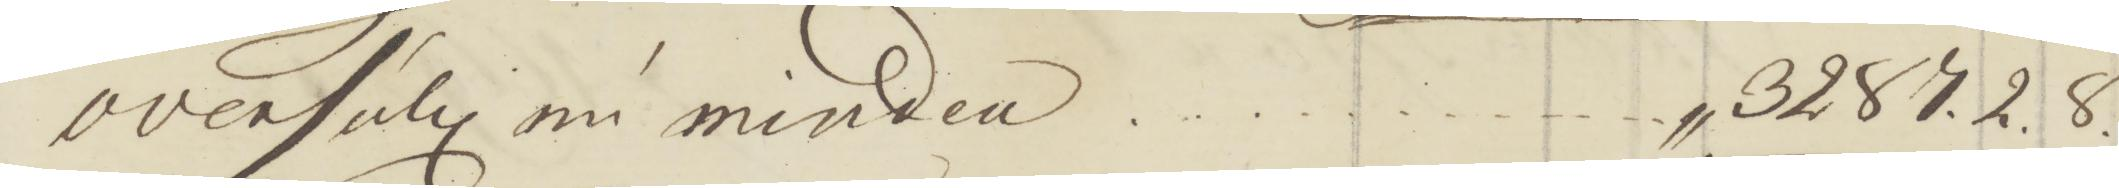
oversulx nu minder . . . . . . . . . . . . „ 3287. 2. 8
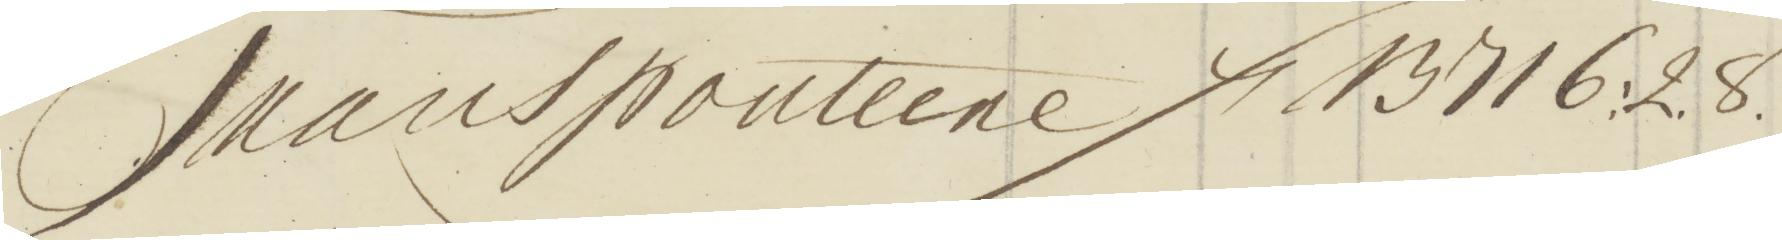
Transporteere ƒ13716: 2. 8.
